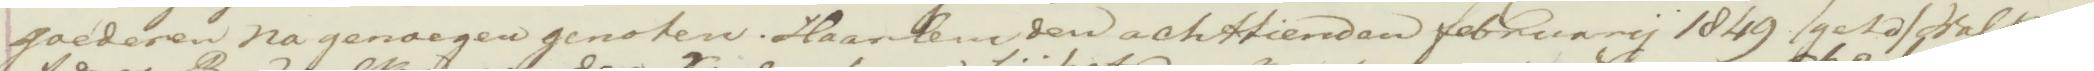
goederen na genoegen genoten Haarlem den achttienden februarij 1849 /getd/ Walter
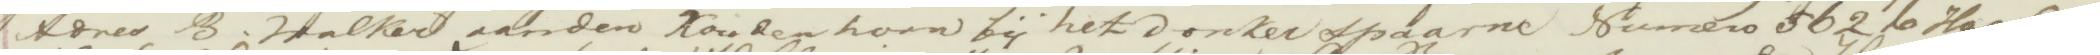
Adres B. walker aan den Kouden horn bij het donker spaarne Numero 562 te Haarlem
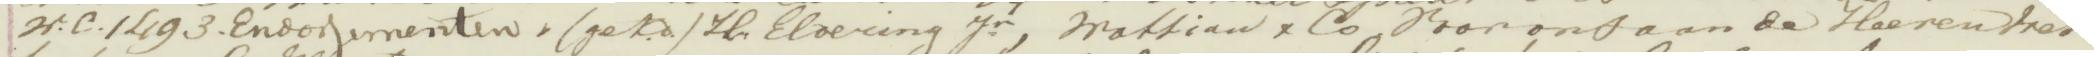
W. C.1493. Endossementen, (getd) H. Eldering J:r, Wattian & Co, Voor ons aan de Heeren dres
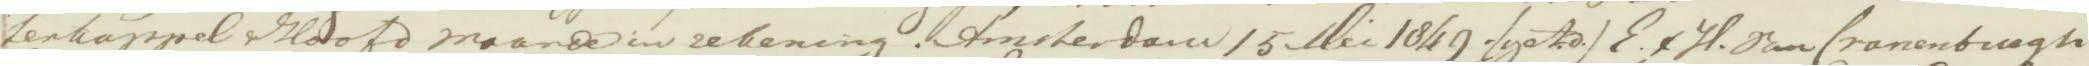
terkoppel J. Hoofd waarde in rekening, Amsterdam 15 Mei 1849 /getd:/ E. & H. Van Cranenburgh
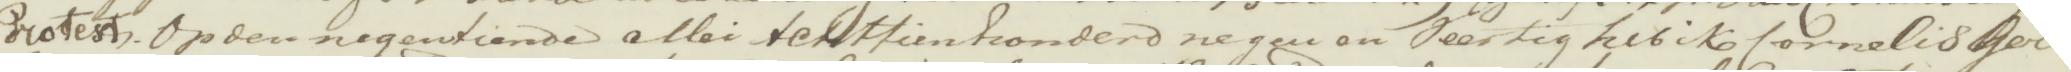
Protest. Op den negentiende Mei Achttienhonderd negen en Veertig heb ik Cornelis Ger
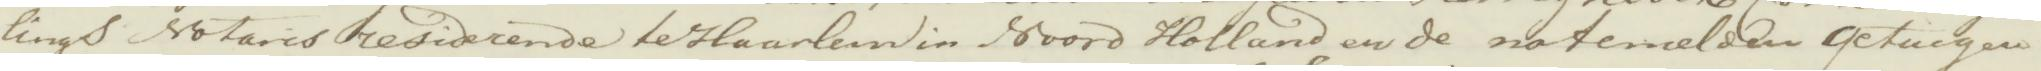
lings Notaris residerende te Haarlem in Noord Holland en de natemelden getuigen
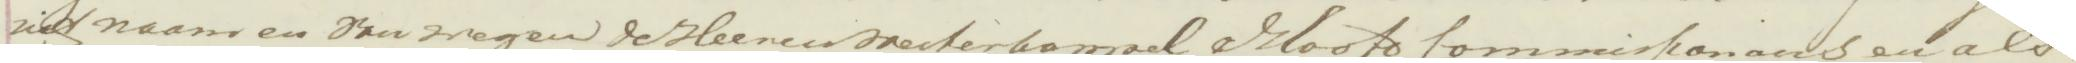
uit naam en van wegen de Heeren Wesserkoppel Hoofd Commissionens en als
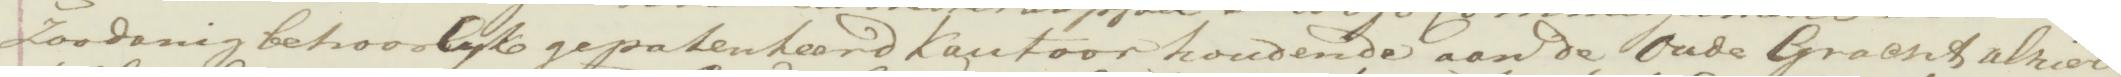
zoodanig behoorlyk gepasenteerd kantoor houdende aan de Oude Gracht alhier
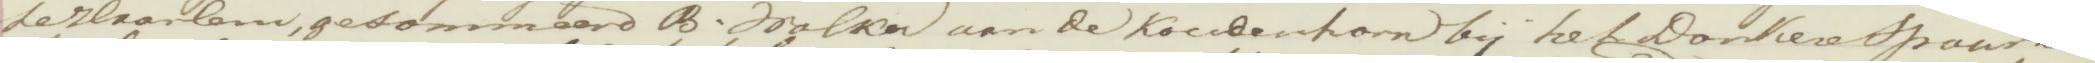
te Haarlem, gesommeerd B. Walker aan de koudenhorn bij het Donkers Spaarne
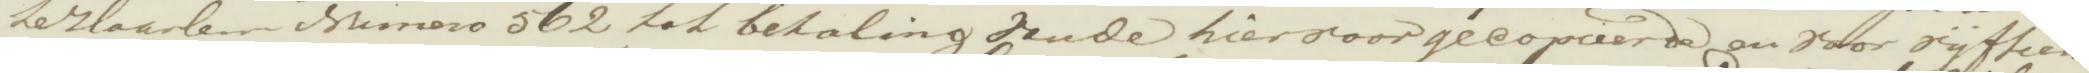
te Haarlem Numero 562 tot betaling vande hier voor gecopceerde en voor vijftien
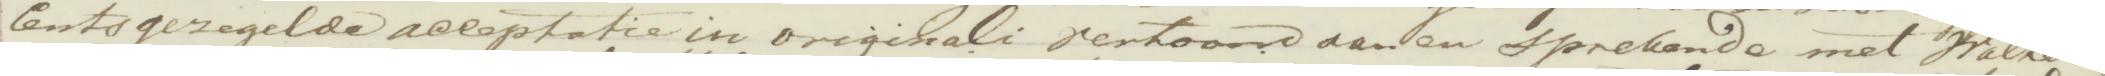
Cents gezegelde acceptatie in originali vertoond aan en sprekende met Walker
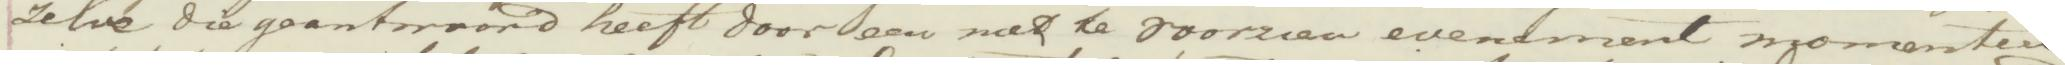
zelve die geantwoord heeft door een niet te voorzien evenement momenteel
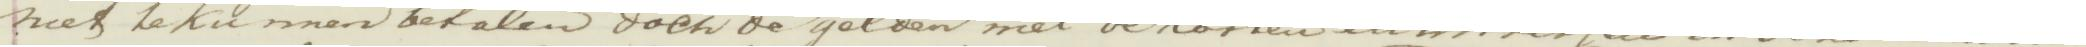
niet te kunnen betalen doch de gelden met de korten en intressen in deze maand
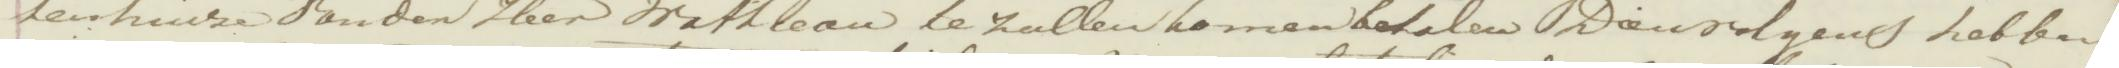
ten huize Van den Heer Watt aan te zullen komen betalen Dienvolgens hebben
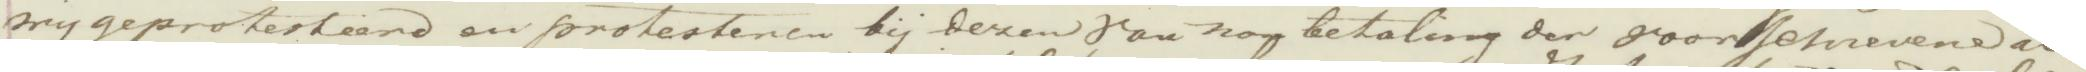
wij geprotesteerd en protestenen bij dezen van nog betaling der voorschrevene ac
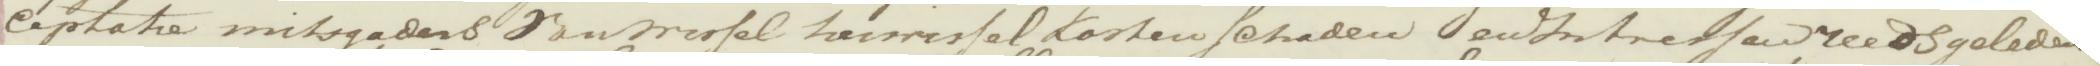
ceptatie mitsgaders van wissel herwissel kosten schaden en Intressen reeds geleden
